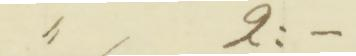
„ 2: -
